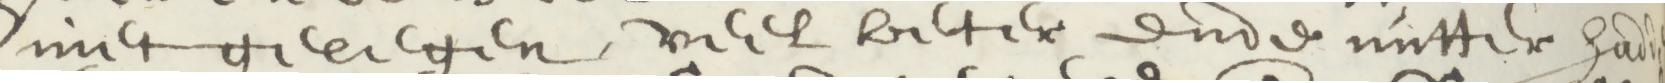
niet gelegen, veel beter ende nutter had
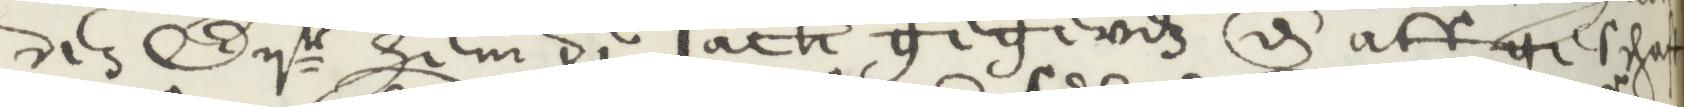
den Ey=r hem de sack gegeven ende affgeschaft
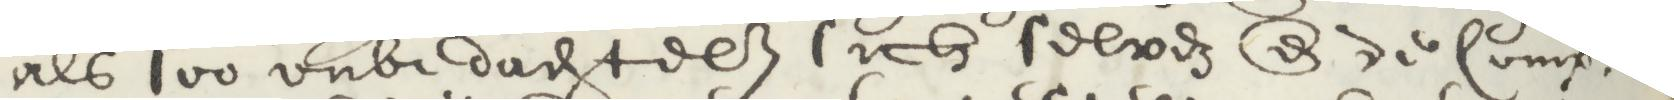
als soo onbedachtelijk sich selven ende Comp.e m
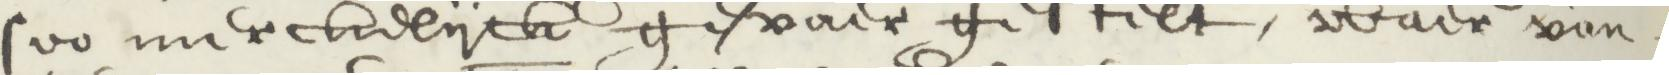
soo merckelijck gevaer gestelt, waer van
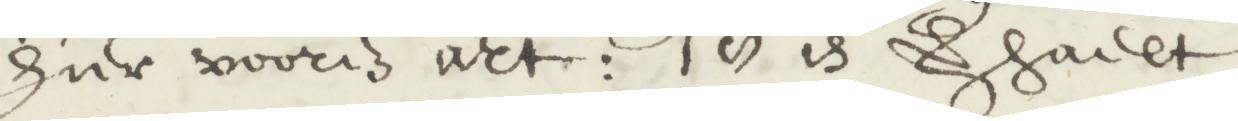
hier vooren art. 18 is verhaelt
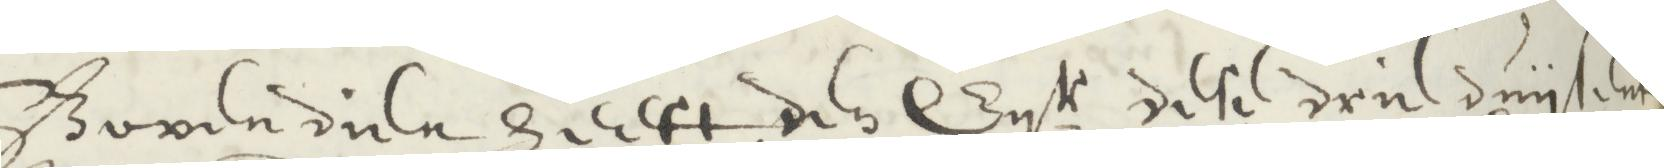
Bovendien heeft den Ey=r dese drie duijsent
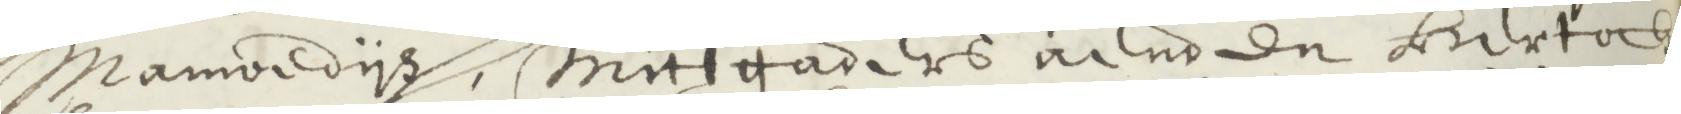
Mamoedijs, mitsgaders aenden hertoch
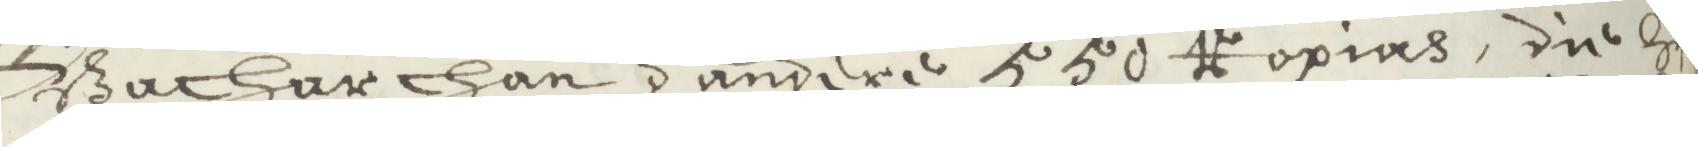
achar chan d'andere 550 Ropias, die h
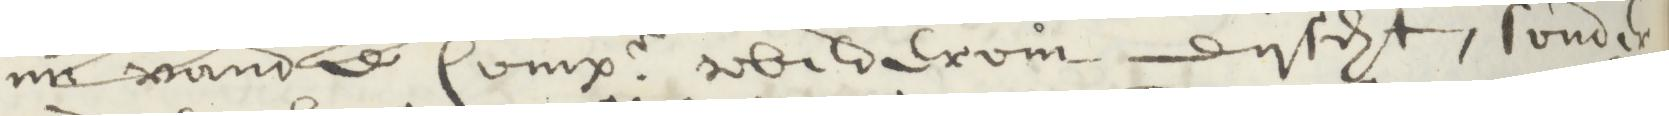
nu vande Comp.e wederom eijscht, sonder
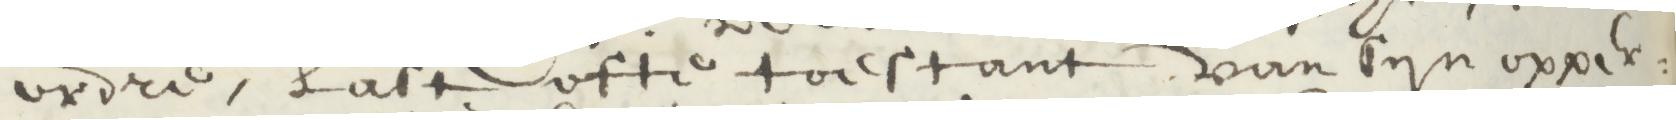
ordre, last efte toestant van syn opper-
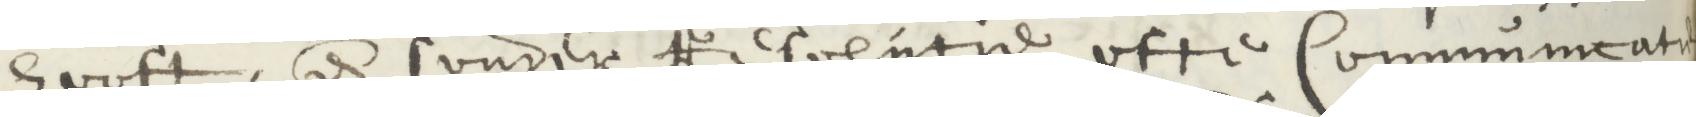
hooft, en sonder Resolutie ofte Communicati
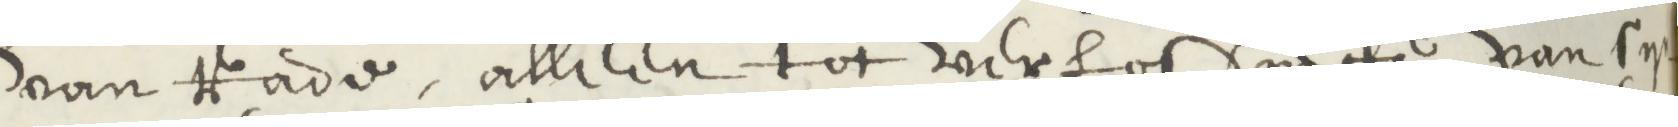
van Rade, alleen tot verlossinge van sy
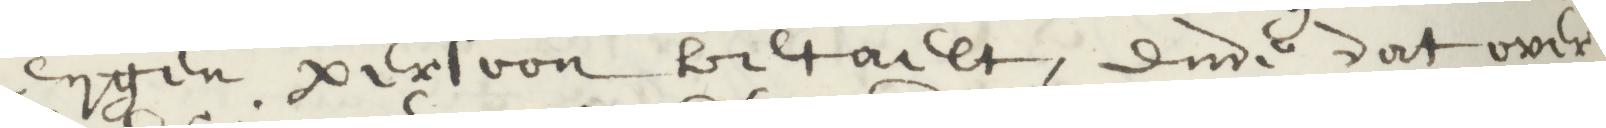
eijgen persoon betaelt, ende dat over
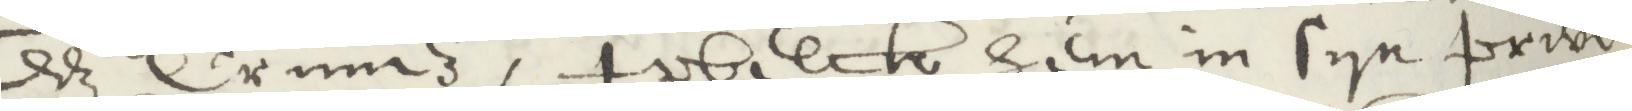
Een Crimen, twelck hem in syn prive
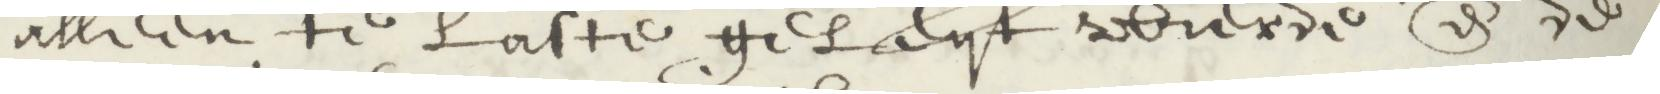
alleen te laste geseyt wierde ende de
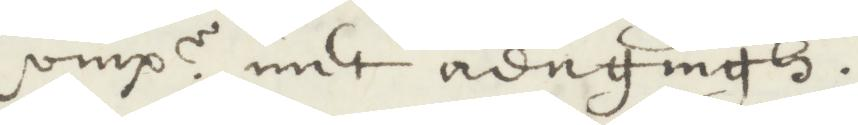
Comp.s niet aengingh.
